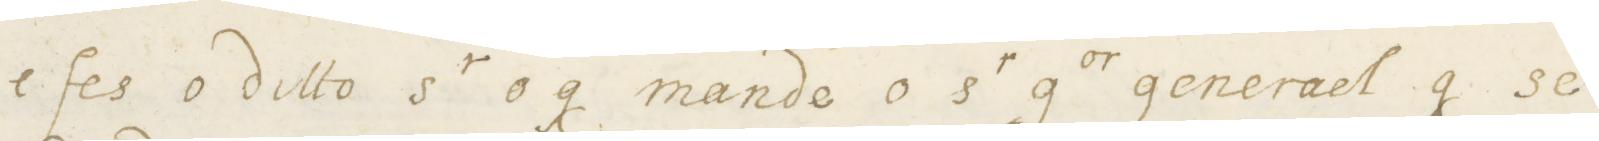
e fes o ditto sr o q mande o sr gor generael q se
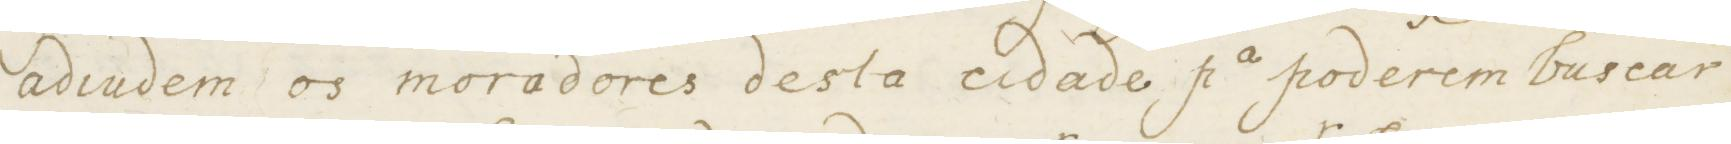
adindem os moradores desta cidade pa poderem buscar
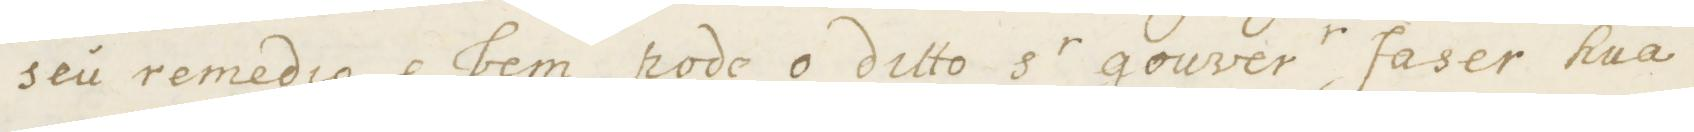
seu remedio e bem pode o ditto sr gouverr faser hua
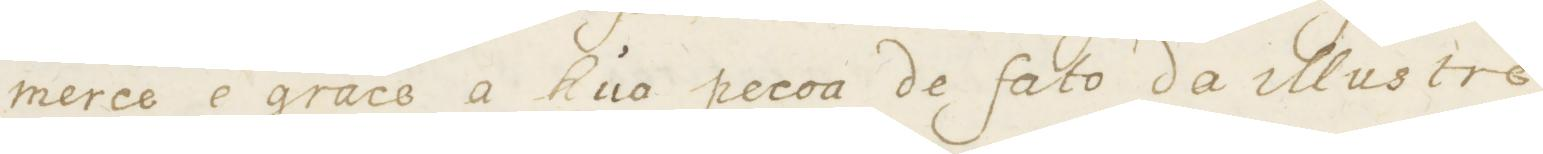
merce e graace a hua pecoa de fato da illustre
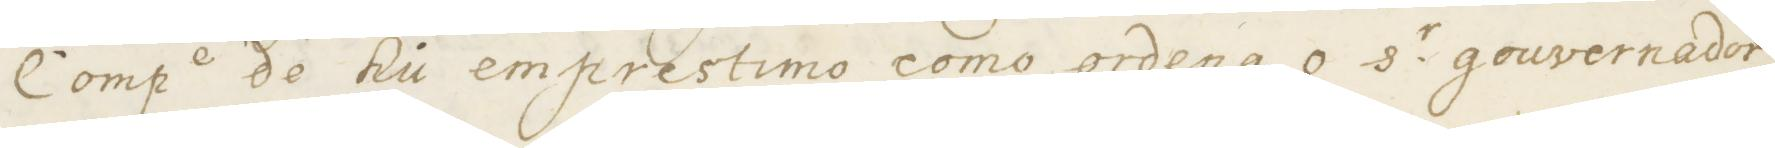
Compe de hu emprestimo como ordena o s.r gouvernador
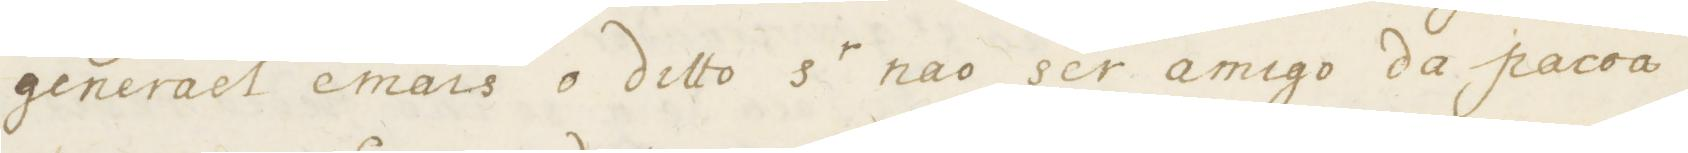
generael emais o ditto sr nao ser amigo da pacoa
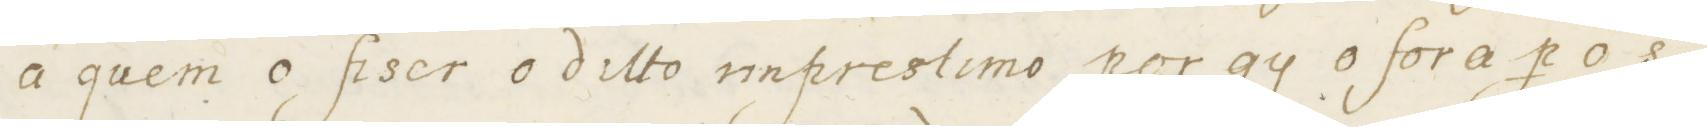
a quem o fiser o ditto imprestimo por qy o fora p o sr
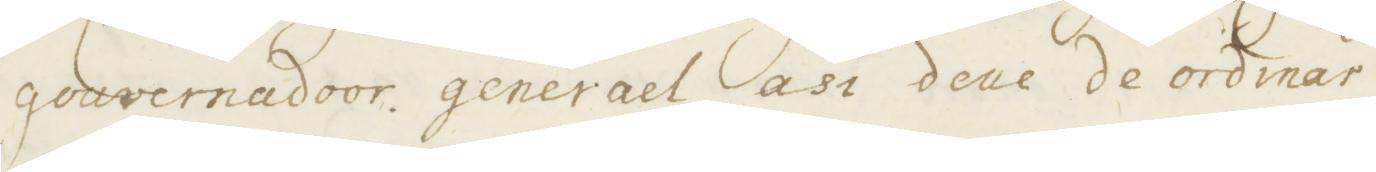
gouvernadoor generael asi dene de ordinar
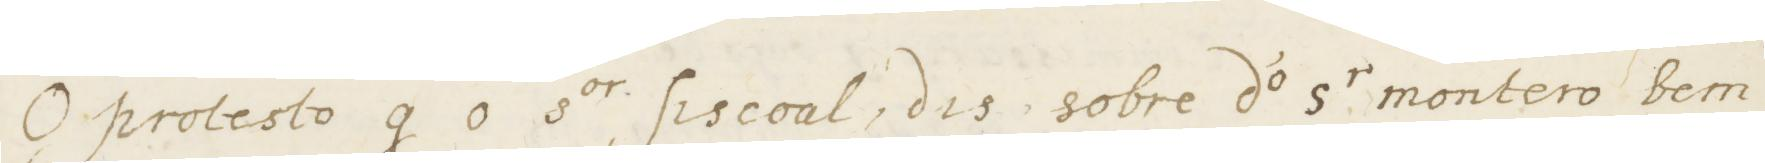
O protesto q o sor. fiscoal, dis, sobre d'o sr montero bem
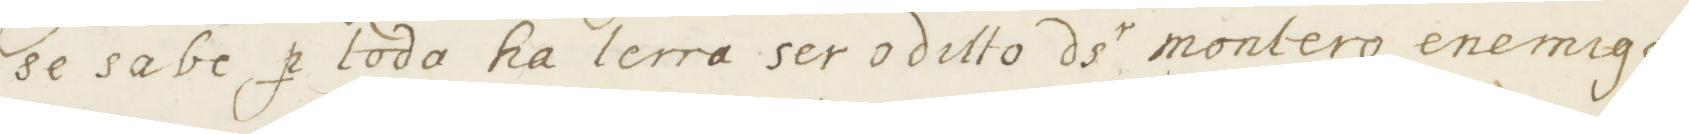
se sabe per toda ha terra ser o ditto dsr montero enemigo
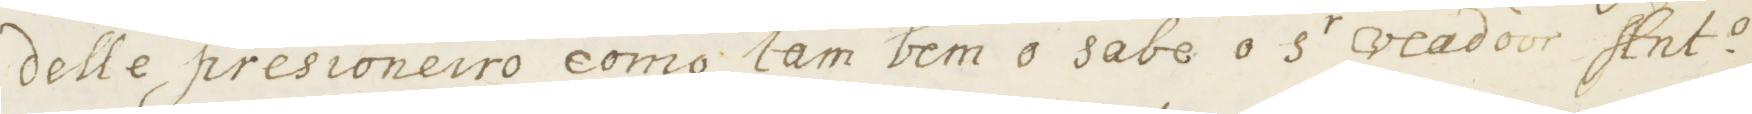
delle presioneiro como tam bem o sabe o sr veadoor Ant.o
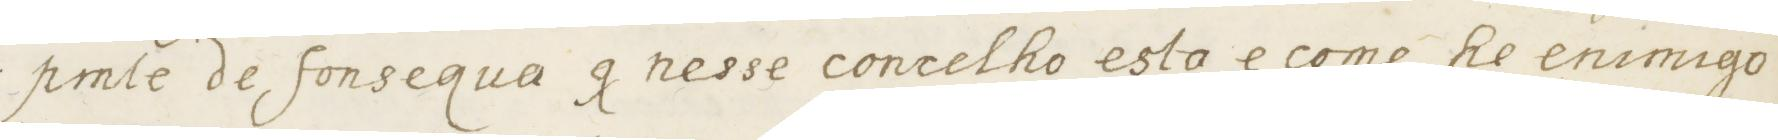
pinte de fonsequa q nesse concelho esta e come he enimigo
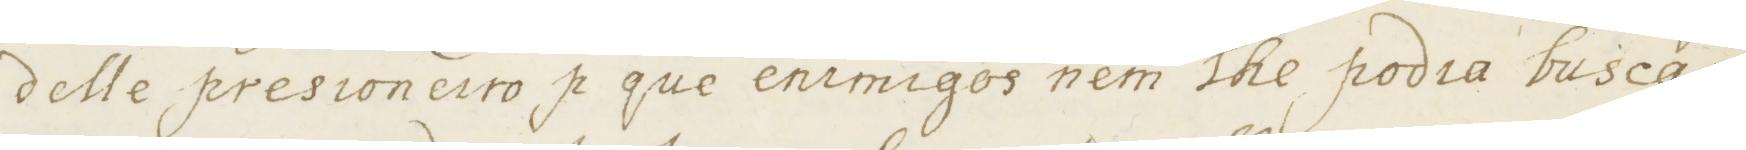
delle presioneiro p que enimigos nem lhe podia buscar
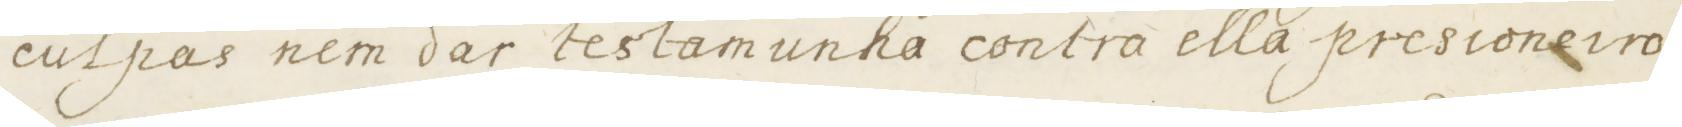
culpas nem dar testamunha contra ella presioneiro
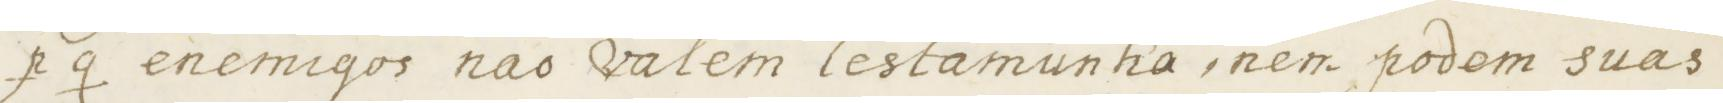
p q enemigos nao valem testamunha, nem podem suas
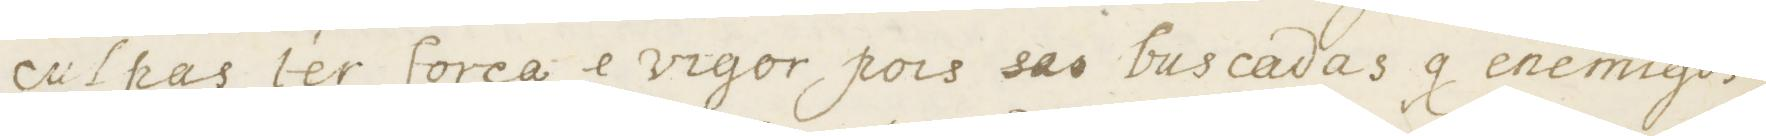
culpas ter forca e vigor pois sao buscadas q enemigos
